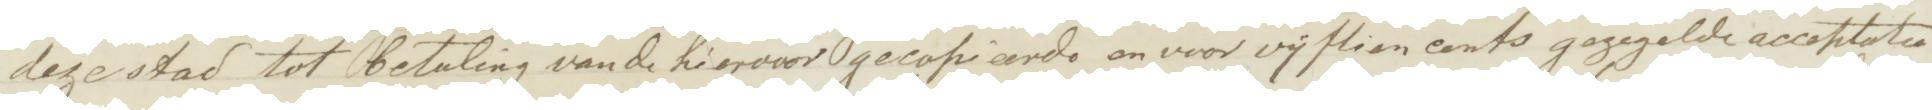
deze stad tot betaling van de hiervoor gecopieerde en voor vijftien cents gezegelde acceptatie
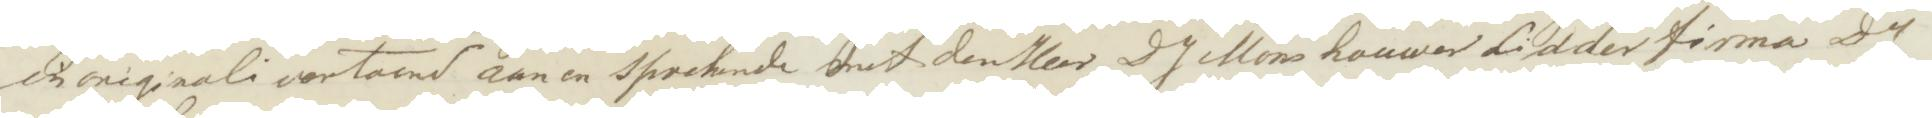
in originali vertoond aan en sprekende met den Heer D J Monshouwer Lid der firma D J
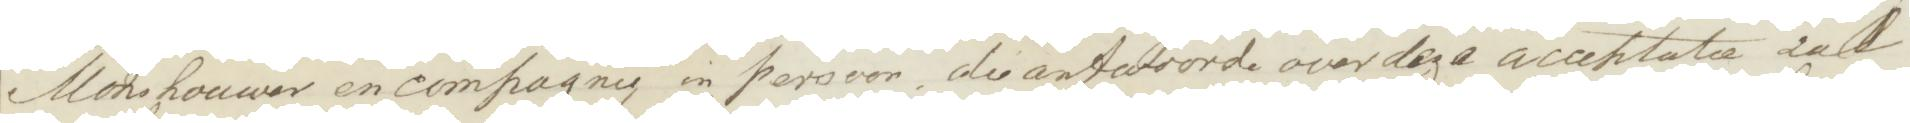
Monshouwer en compagnie in persoon, die antwoorde over deze acceptatie zal
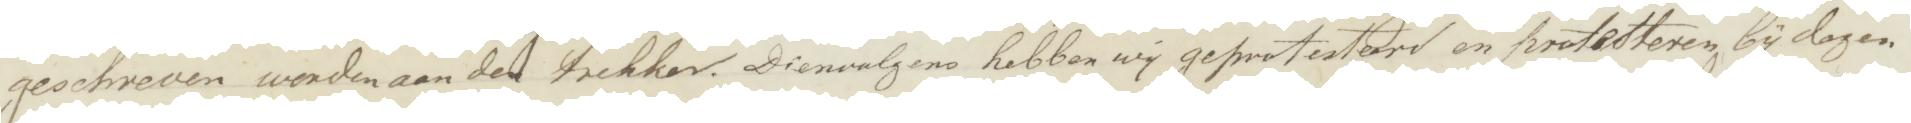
geschreven worden aan den trekker. Dienvolgens hebben wij geprotesteerd en protesteren bij dezen
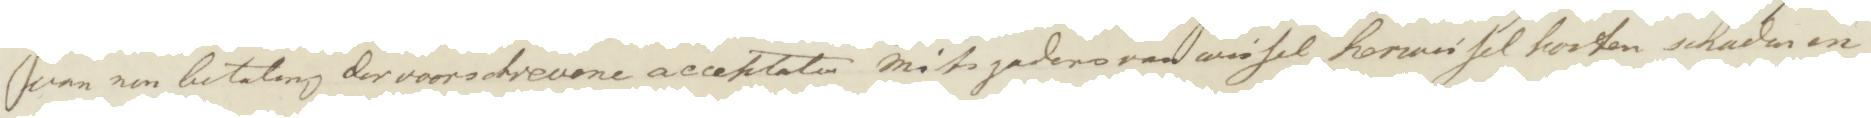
van non betaling der voorschrevene acceptatie mitsgaders van wissel herwissel kosten schaden en
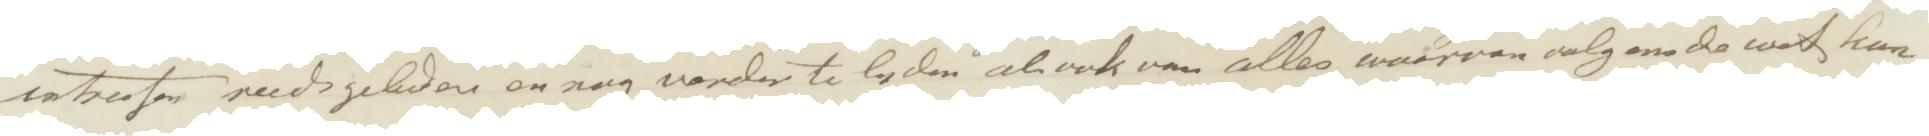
intressen reeds geleden en nog verder te lyden als ook van alles waarvan volgens de wet kan
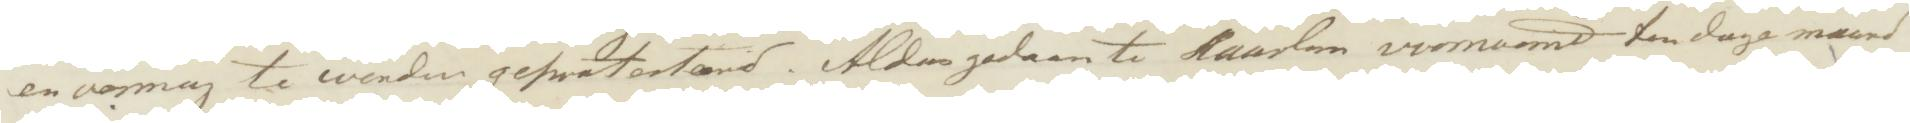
en vermag te worden geprotesteerd. Aldas gedaan te Haarlem voornoemd ten dage maand
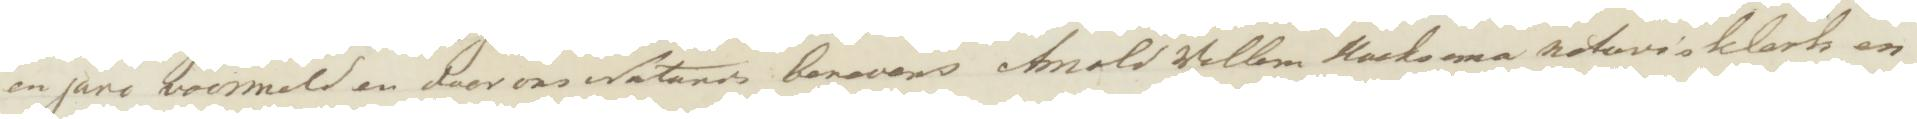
en jare voormeld en door ons Notaris benevens Arnold Willem Haeksema notaris klerk en
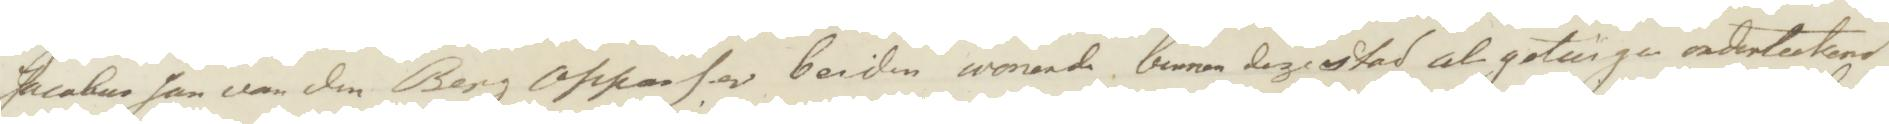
Jacobus Jan van den Berg Oppasser beiden wonende binnen deze stad als getuigen onderteekend
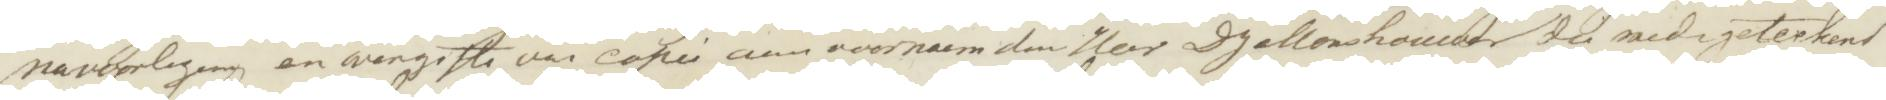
na voorlezing en overgifte van copie aan voornoemden Heer D J Monshouwer die mede geteekend
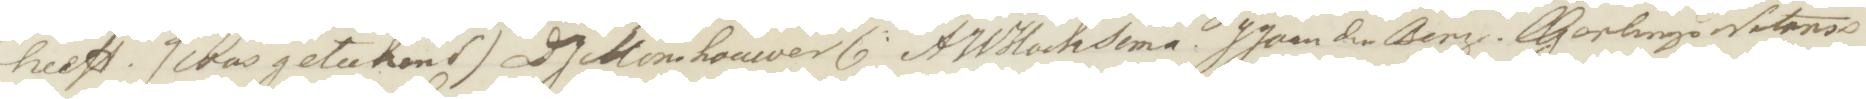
heeft. (was geteekend) D J Monshouwer C.o A W Haeksema. J J van den Heer. C Gerlings Notaris
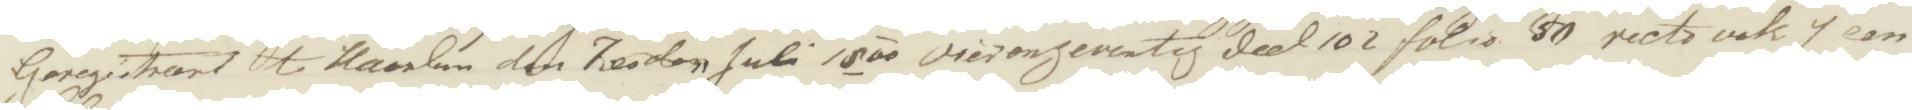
Geregistreerd te Haarlem den Zesden Juli 1800 vierenzeventig deel 102 folio 50 recto vak 7 een
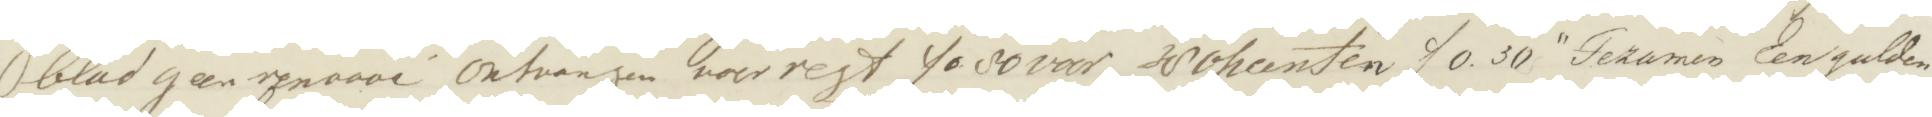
blad geen renvooi Ontvangen voor regt ƒ 0.80 voor 38 opcenten ƒ 0.30" Tezamen Een gulden
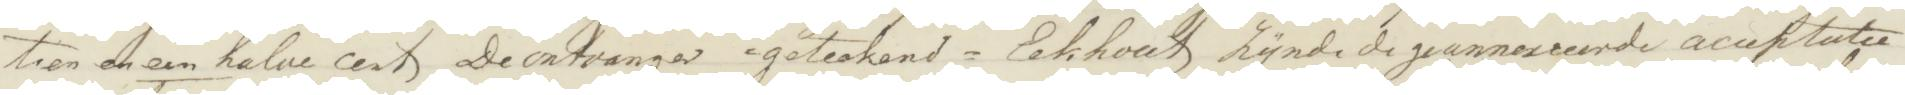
tien en een halve cent De ontvanger = geteekend = Eekhout zijnde de geannexceerde acceptatie
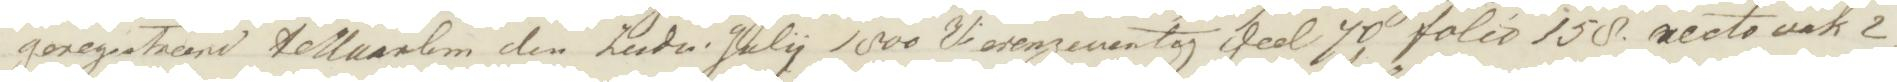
geregistreerd te Haarlem den Zesden Julij 1800 Vierenzeventig deel 70 folio 158 recto vak 2
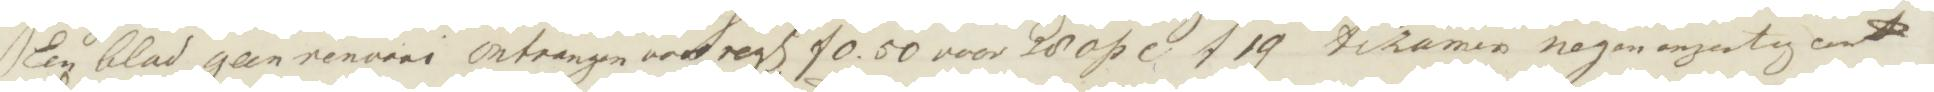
Een blad geen renvooi Ontvangen voor regt ƒ 0. 50 voor 38 opc ƒ 19 tezamen negen enzestig cent
